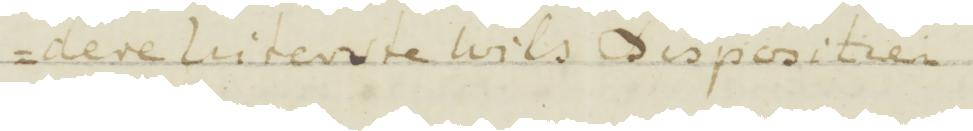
=dere uiterste wils Dispositien
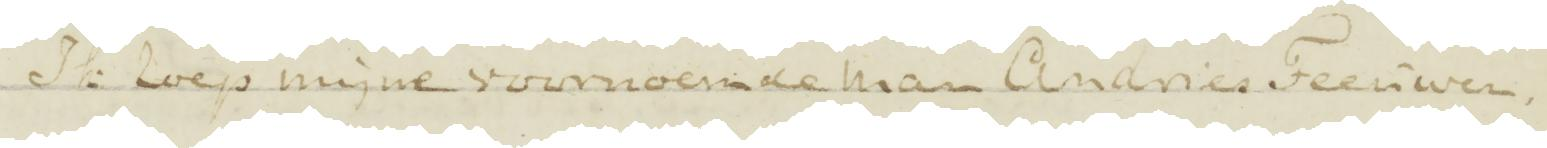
Jk roep mijne voornoemde man Andries Teeuwen,
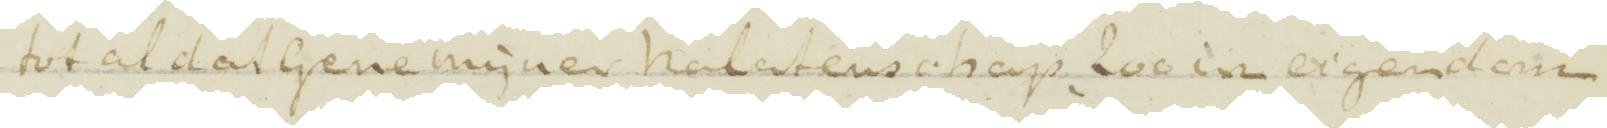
tot al dat Gene mijner Nalatenschap zoo in eigendom
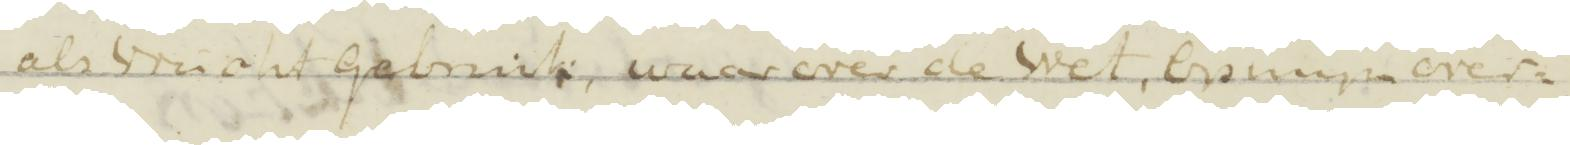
als vruchtgebruik, waarover de wet, op myn over=
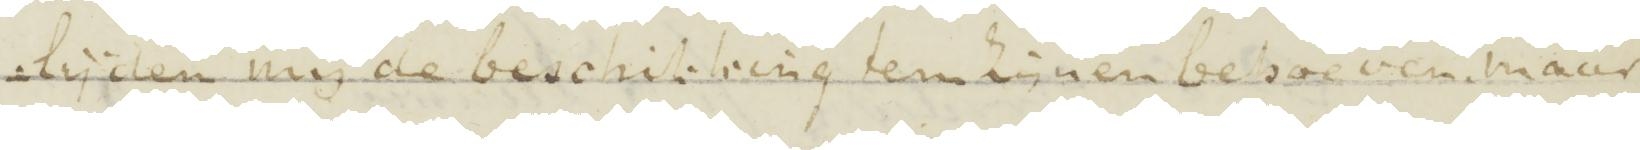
=lijden mij de berschikking ten zijnen behoeven, maar
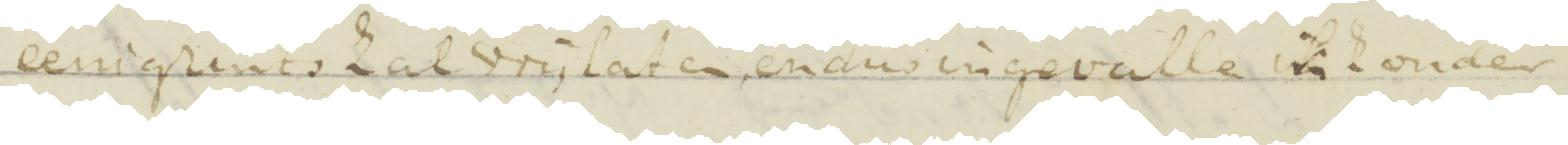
eenigzints zal vrijlaten, en dus in gevalle ik zonder
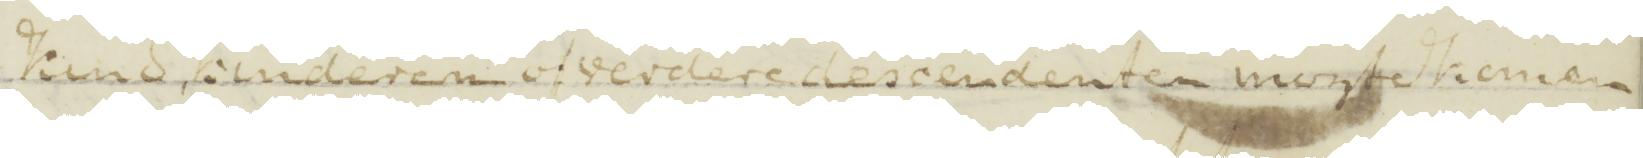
kind, kinderen of verdere descendenten mogte komen
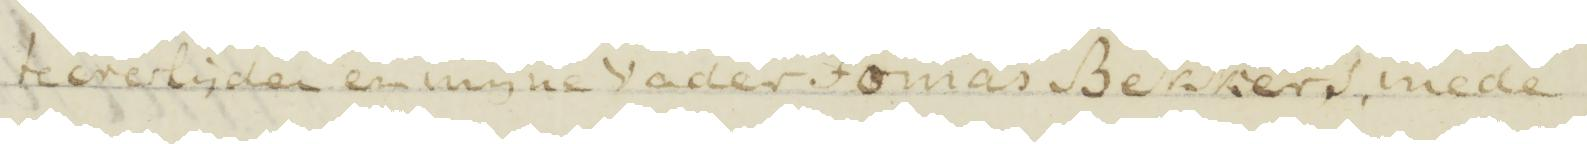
te overlijden en mijne vader Tomas Bekkers, mede
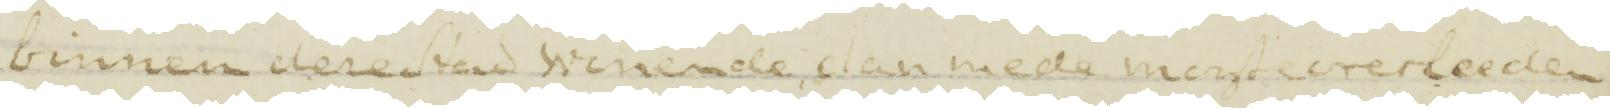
binnen deze stad wonende, dan mede mogte overleeden
